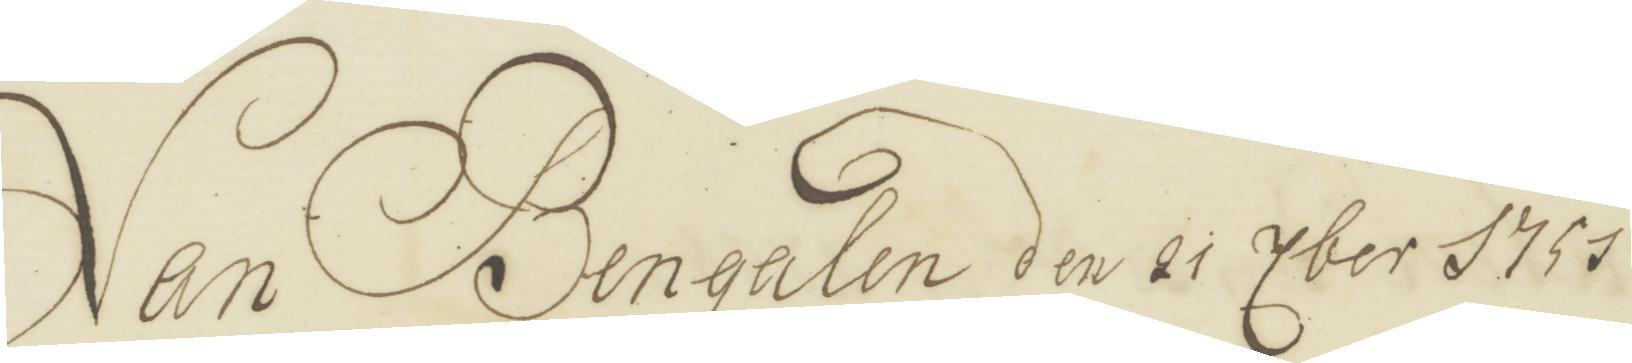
Van Bengalen den 2 xber 1751
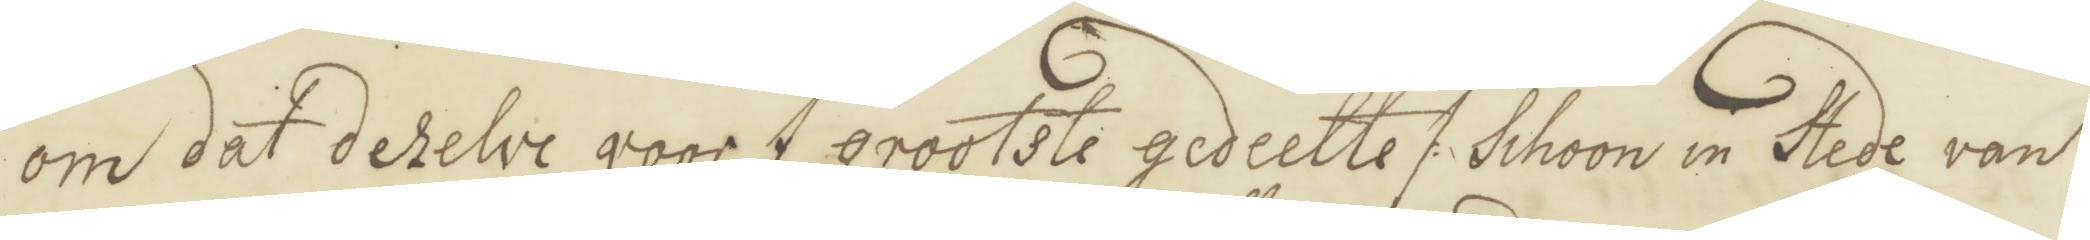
om dat dezelve voor 't grootste gedeelte /: schoon in stede van
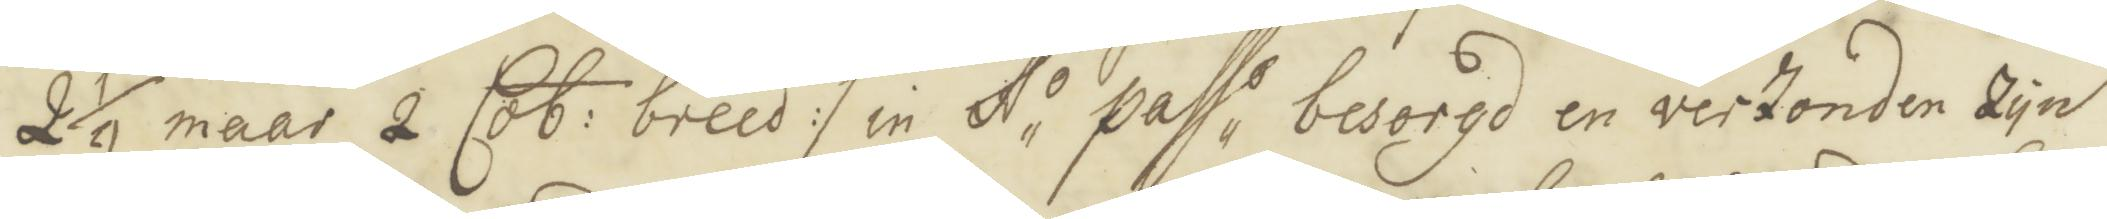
2¼ maar 2 Cob: breed :/ in A„o pass„o besorgd en verzonden zijn
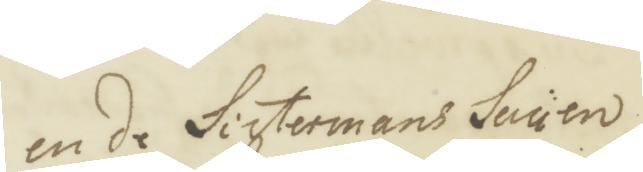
en de sictermans saijen
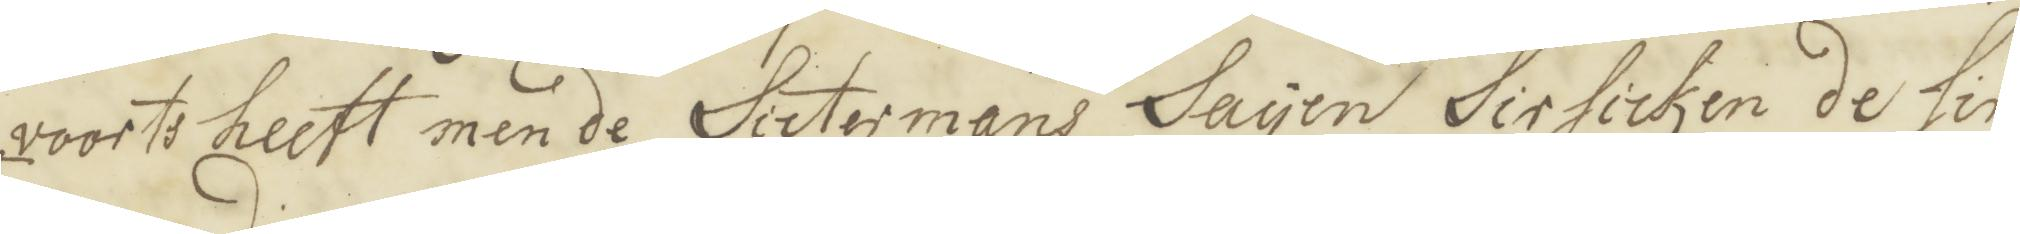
voorts heeft men de sictermans saijen, sirsicken de sir
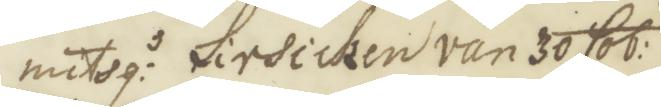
mitsg:s sirsicken van 30 Cob:
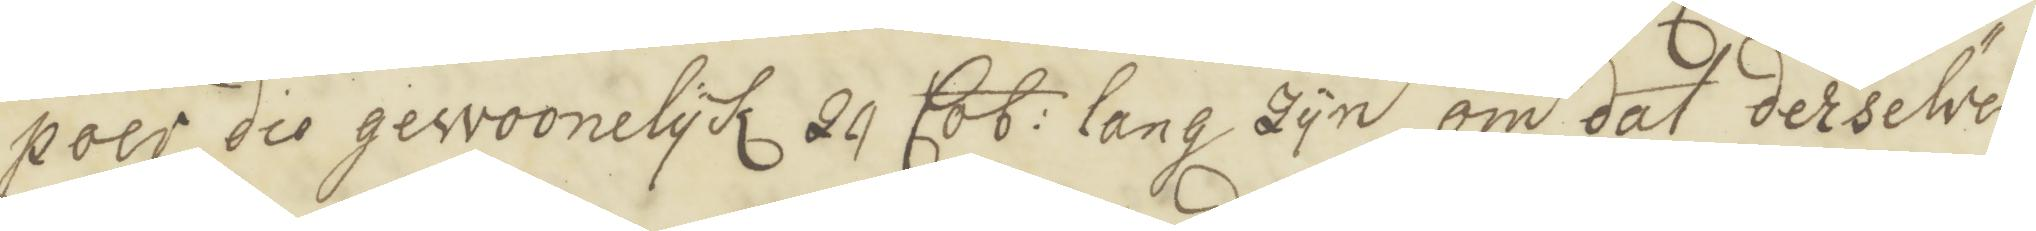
poer, die gewoonelijk 24 Cob: lang zijn om dat derselver
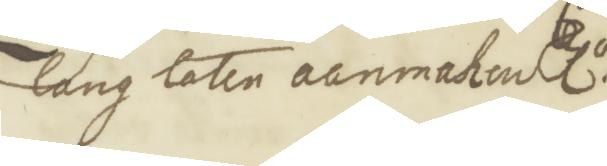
lang laten aanmaken &,a
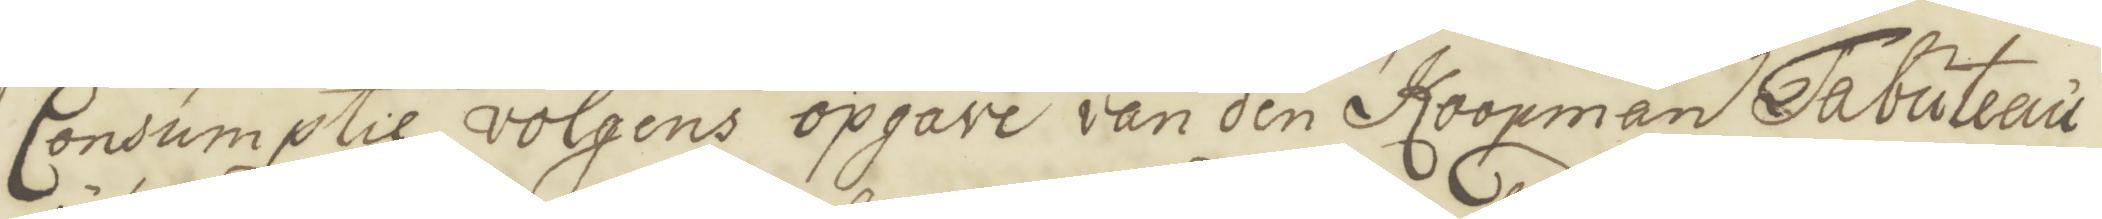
Consumptie volgens opgave van den Koopman Tabuteau
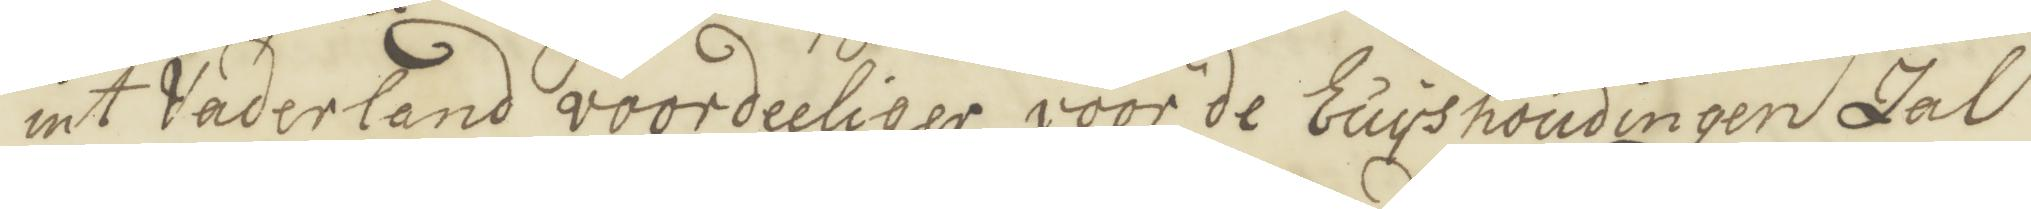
in't vaderland voordeeliger voor de huijshoudingen zal
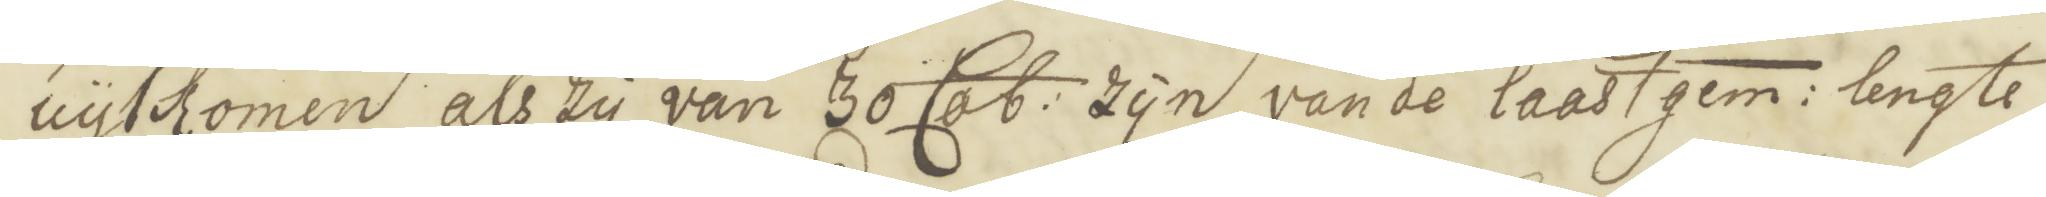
uijtkomen als zij van 30 Cob: zijn van de laast gem: lengte
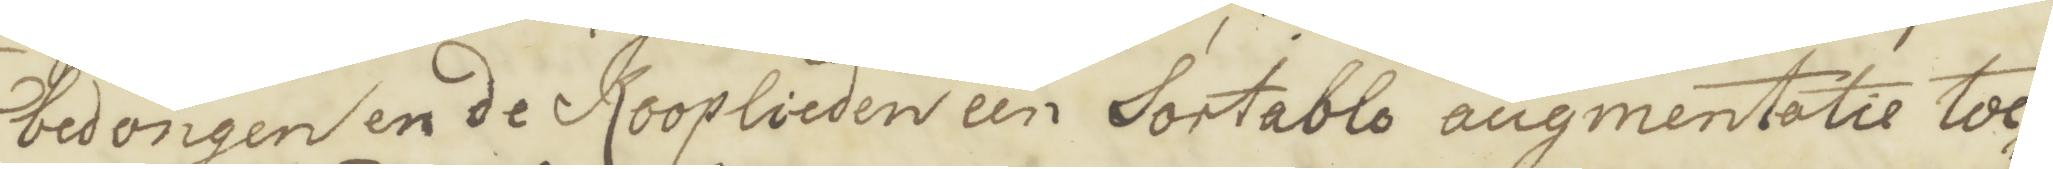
bedongen en de Kooplieden een sortablo augmentatie toe
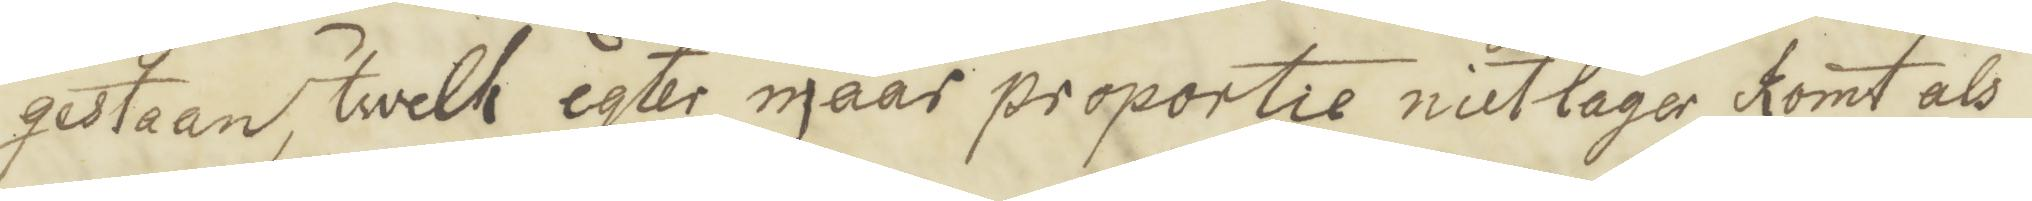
gestaan 'twelk egter maar proportie niet lager komt als
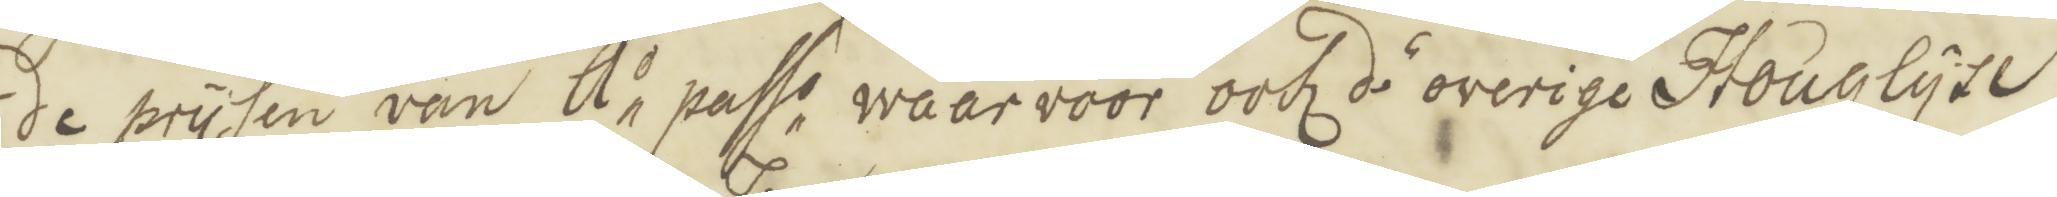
de prijsen van a„o pass„o waar voor ook d' overige Houglijse
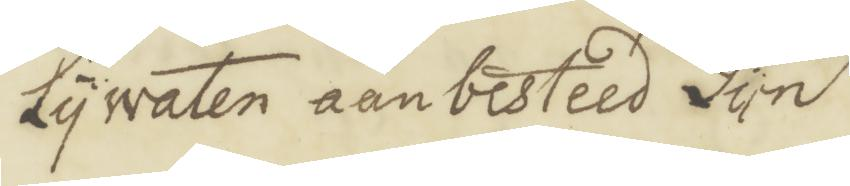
Lijwaten aan besteed zijn
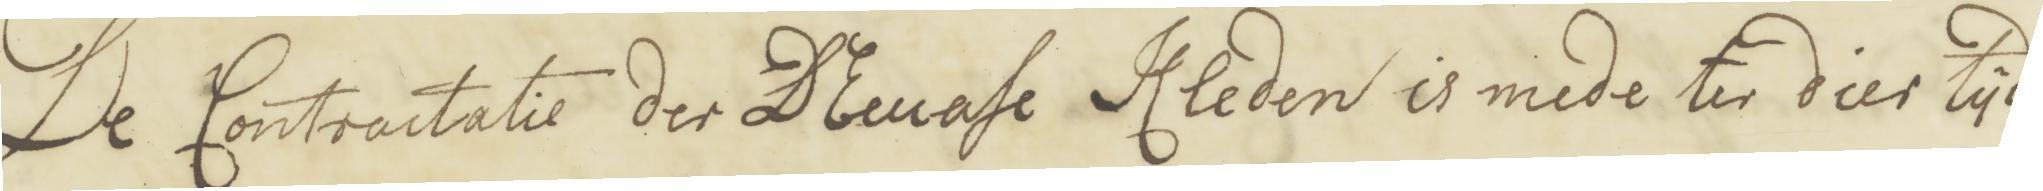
De Contractatie der Dhenase Kleden is mede ter dier tijd
